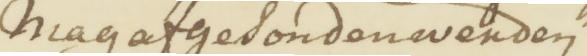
mag afgesonden werden
